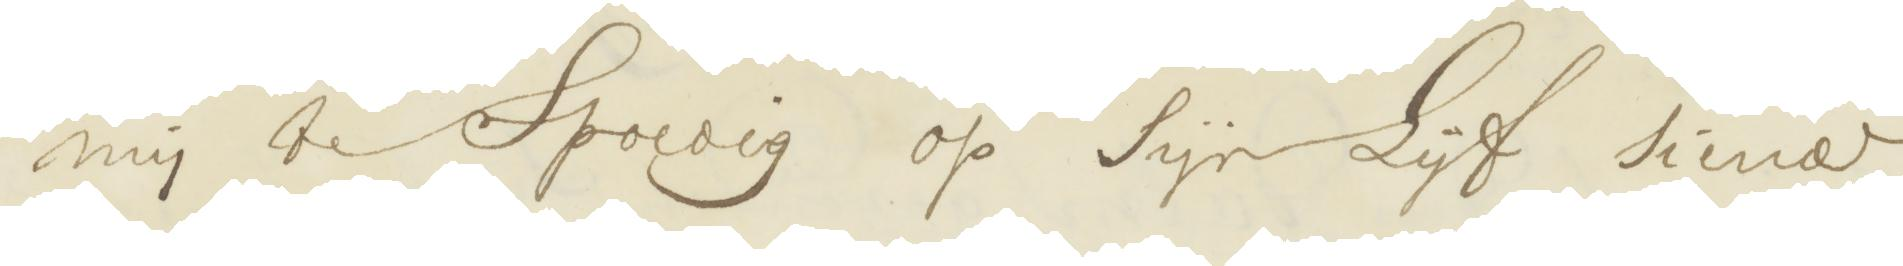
mij te spoedig op sijn lijf siende
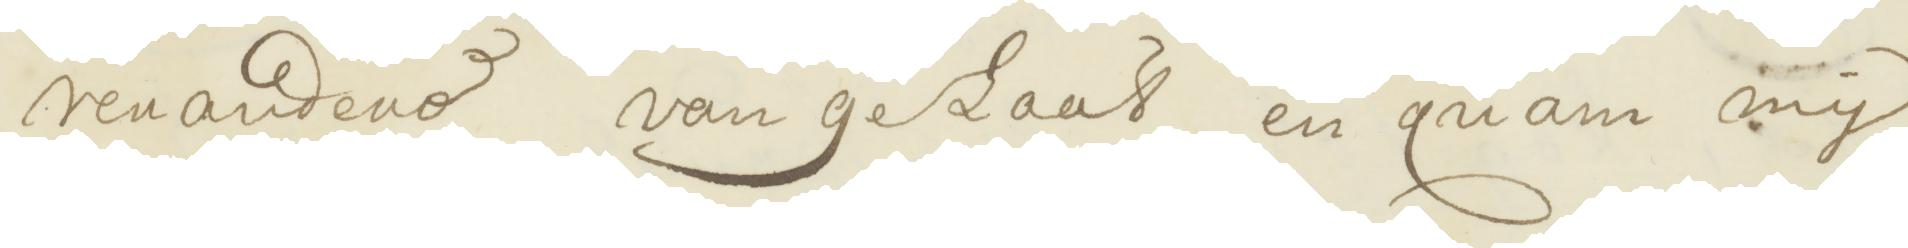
veranderd van gelaat en quam mij
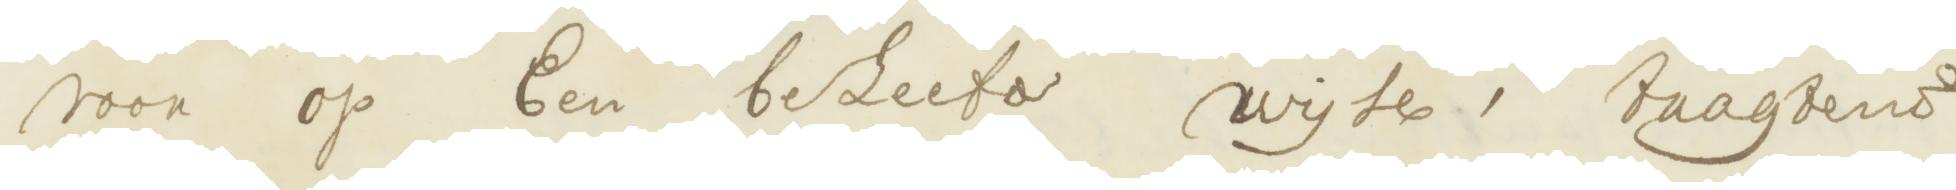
voor op Een beleefd wijse, tragtens
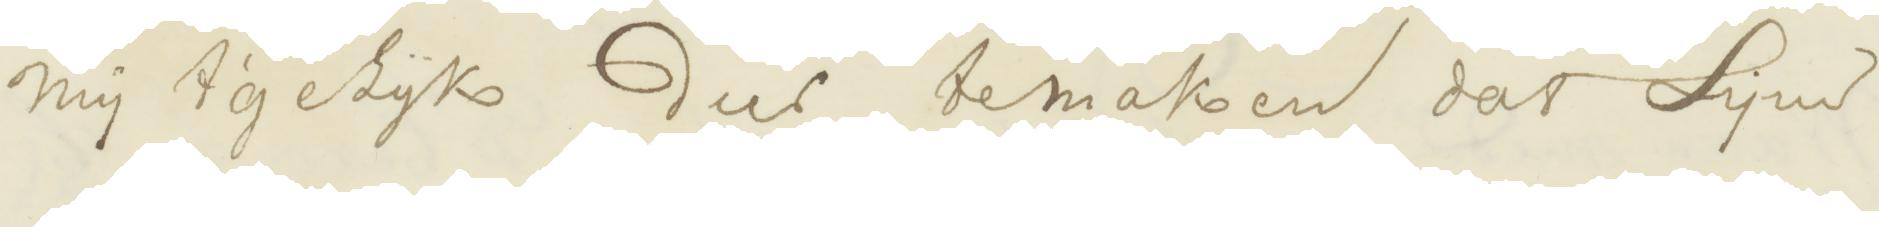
mij t'gelijk dus temaken dat sijne
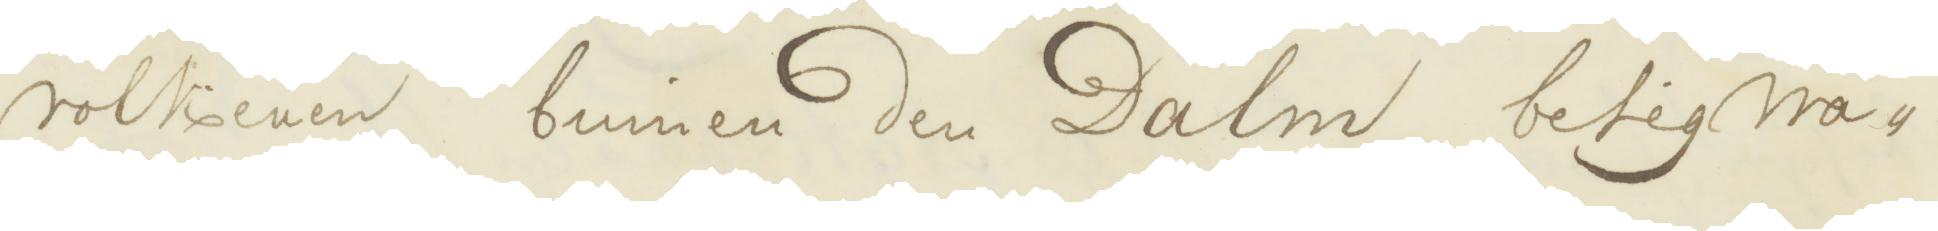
volkeren binnen den Dalm besig wa„
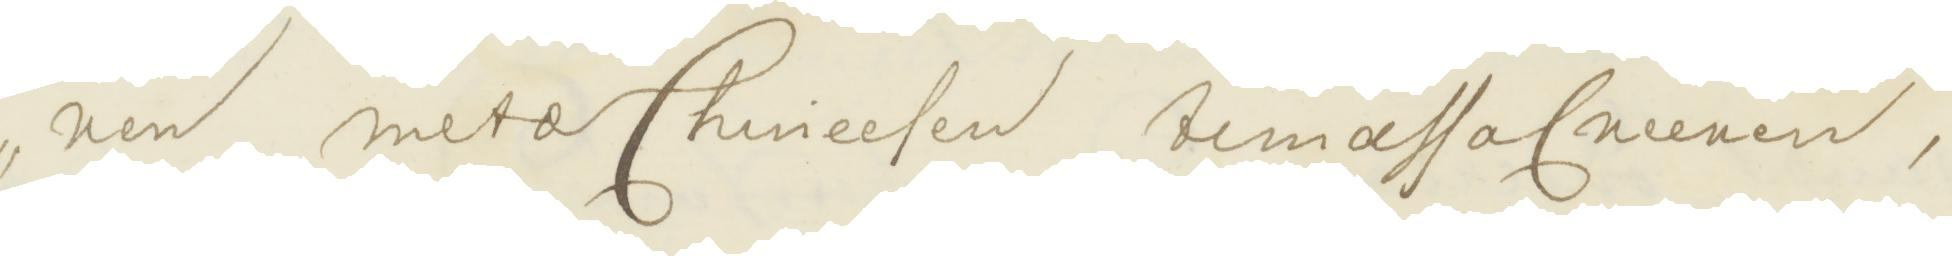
„ven metd Chineesen temassacreeren,
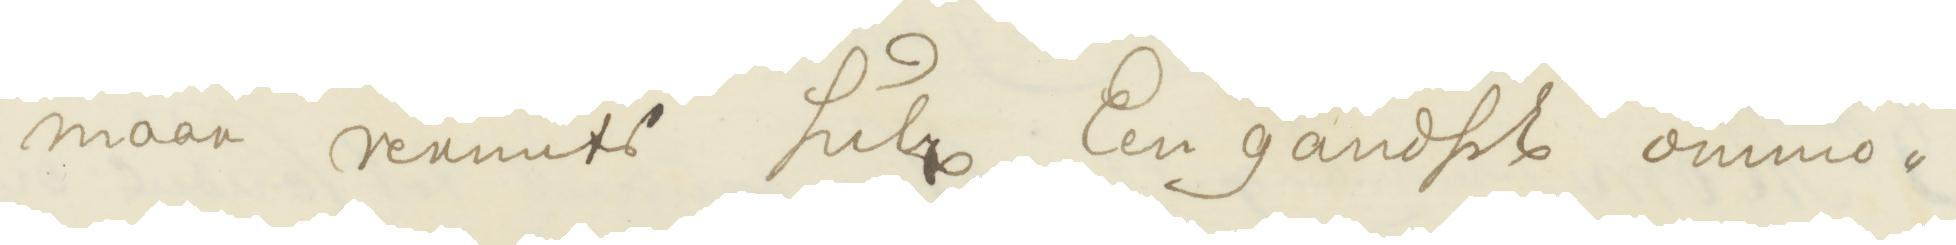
maar vermits sulx Een gandsch ommo„
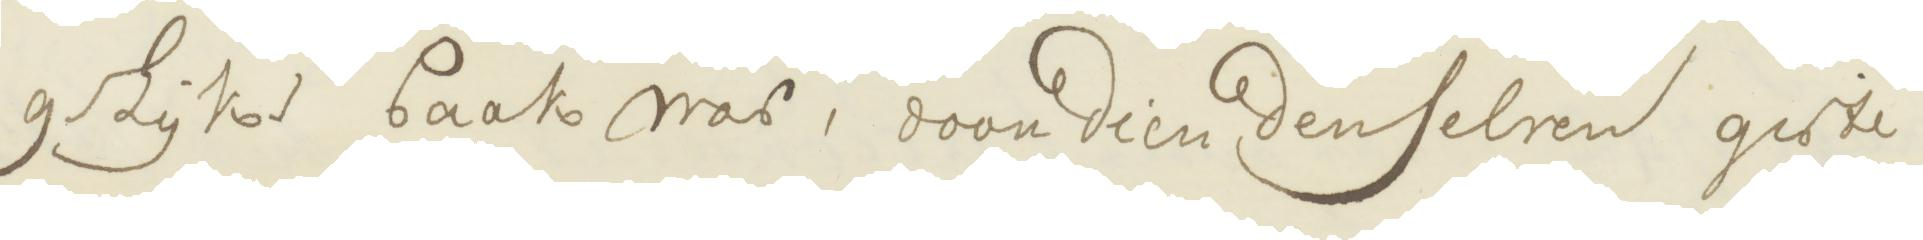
gelijks saak was, door dien denselven giste
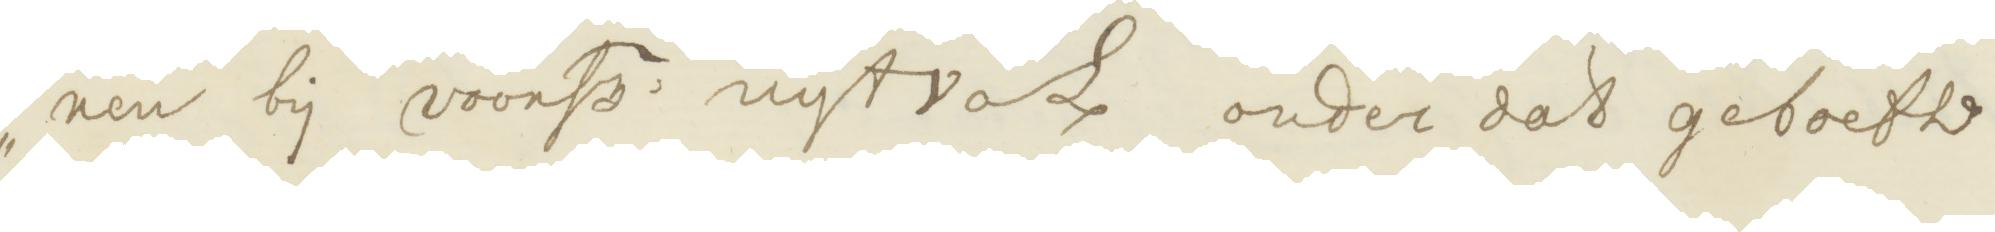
„ren bij voorsz: uijtval onder dat geboefte
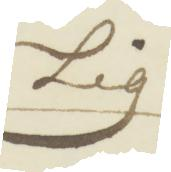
zig
